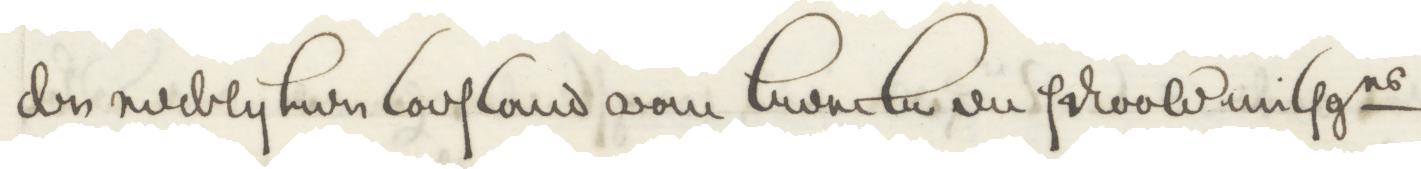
den redelijken toestand van kerck en schoole mitsg=rs
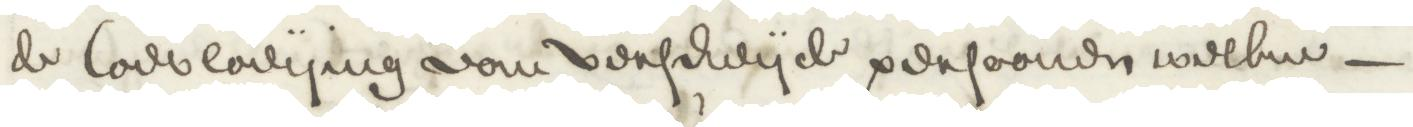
de toevloeijing van verscheijde persoonen welke —
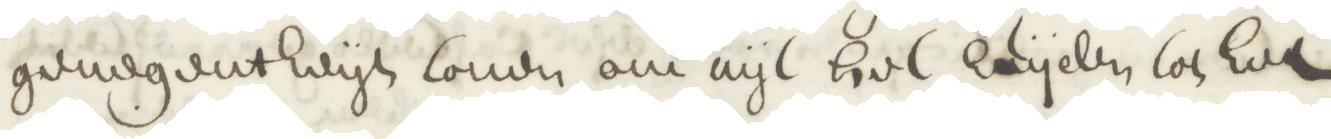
genegentheijt tonen om uijt het heijden tot het
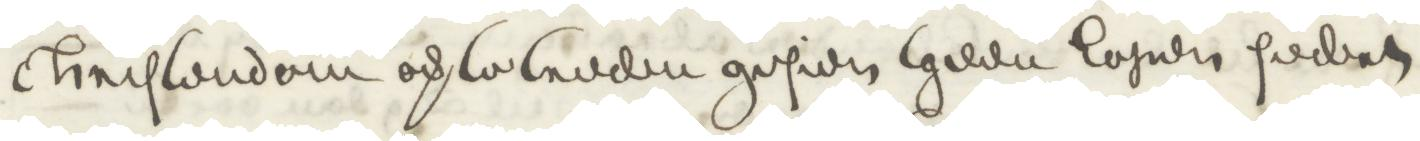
christendom over te treden gesien 'tgeen hopen sedert
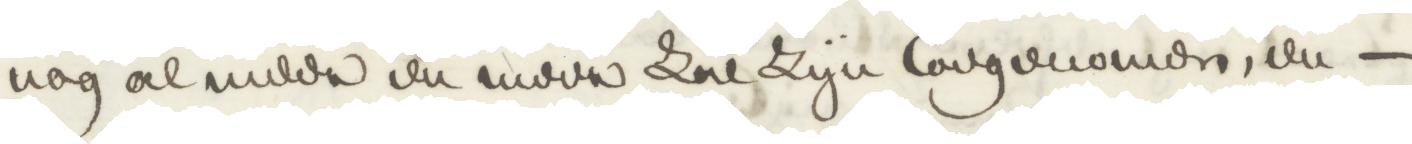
nog al meer en meer zal zijn toegenomen, en —
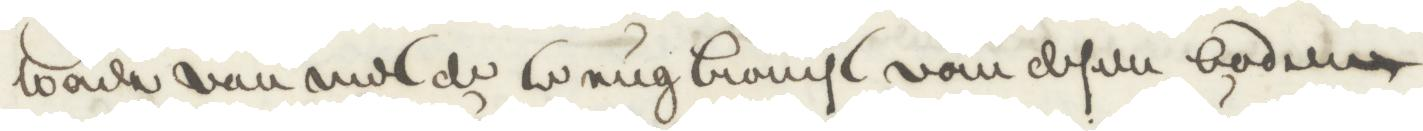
waer van met de te rug komst van desen bodem
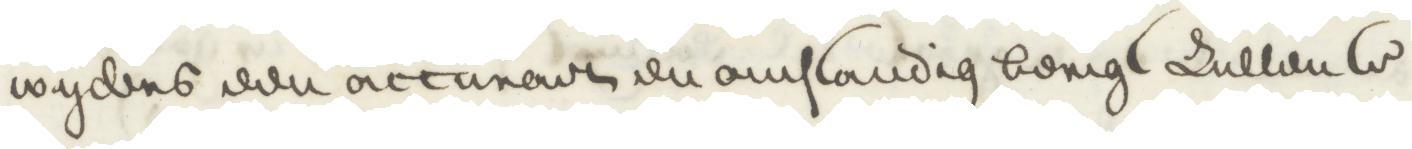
wijders een accuraet en omstandig berigt zullen te
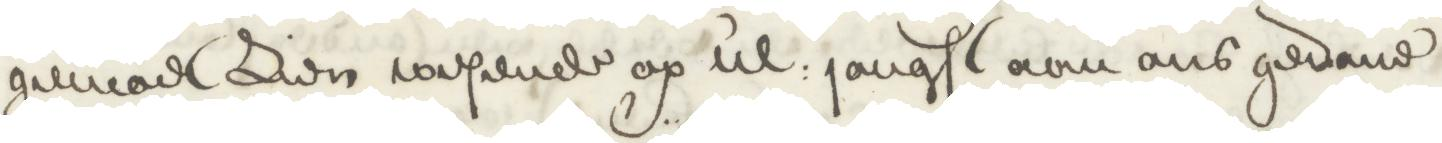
gemoet zien wesende op ul: jongst aan ons gedane
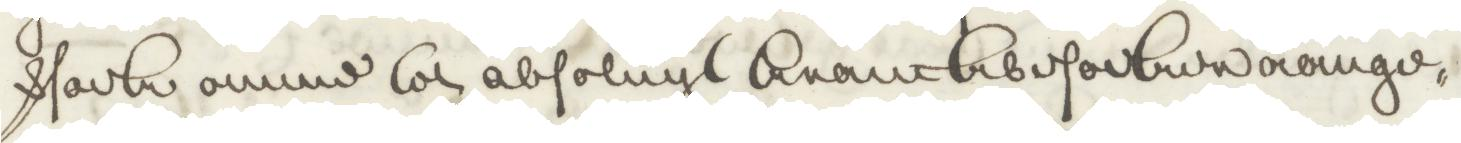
versoek omme tot absoluijt kranckbesoeker aange„
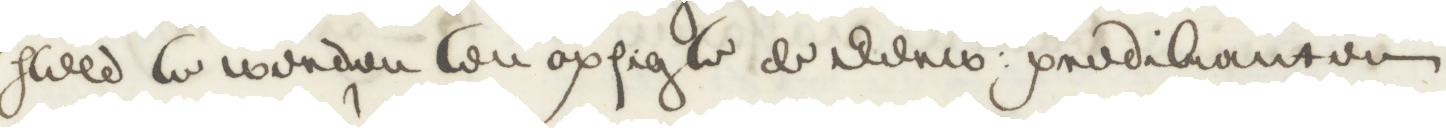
steld te werden ten opsigte de eerw: predikanten
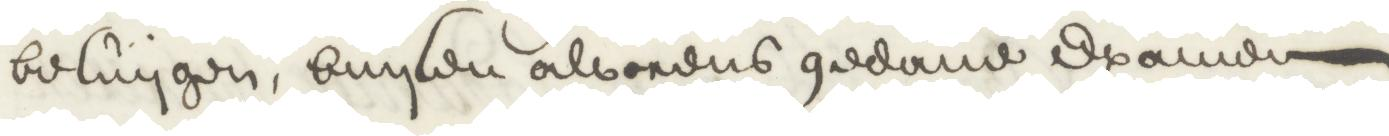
betuijgen, buijten alvorens gedane examen
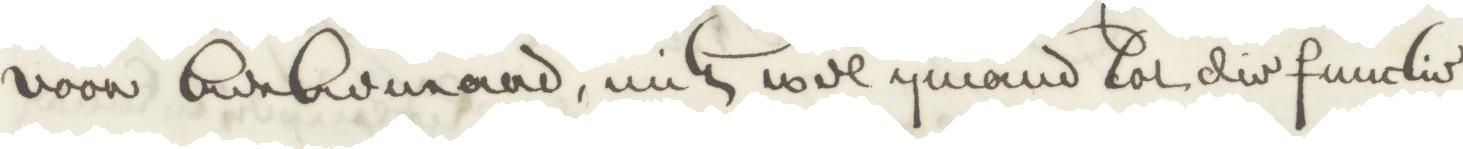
voor kerkenraad, niet wel ijmand tot die functie
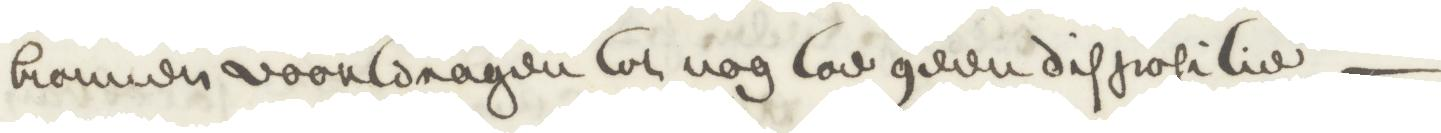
konnen voortdragen tot nog toe geen dispositie —
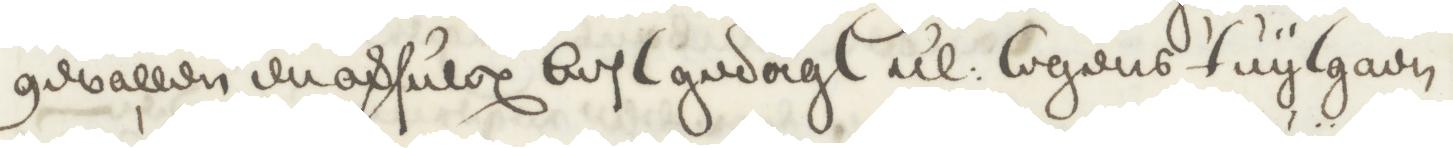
gevallen en oversulcx best gedagt ul: tegens 't uijtgaen
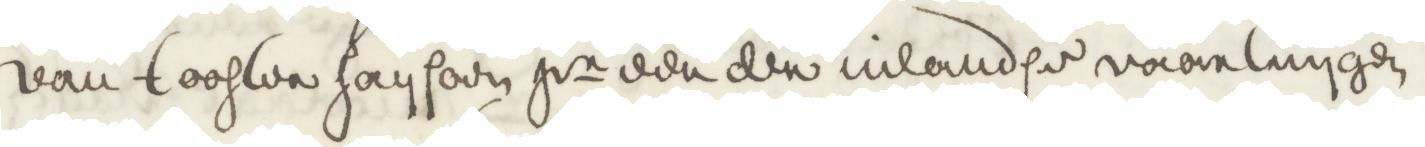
van 't ooster saijsoen p=r een der inlandse vaartuijgen
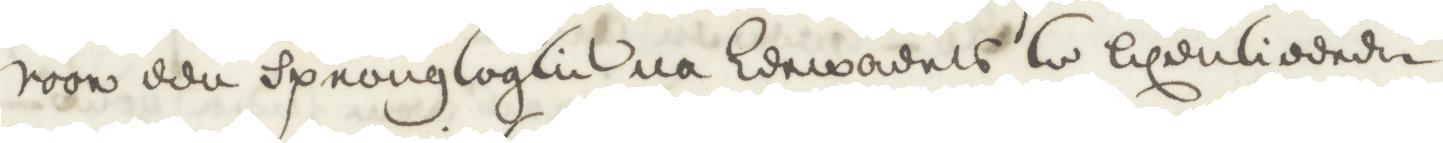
voor een sprongtogtie na herwaerts te licentieeren
